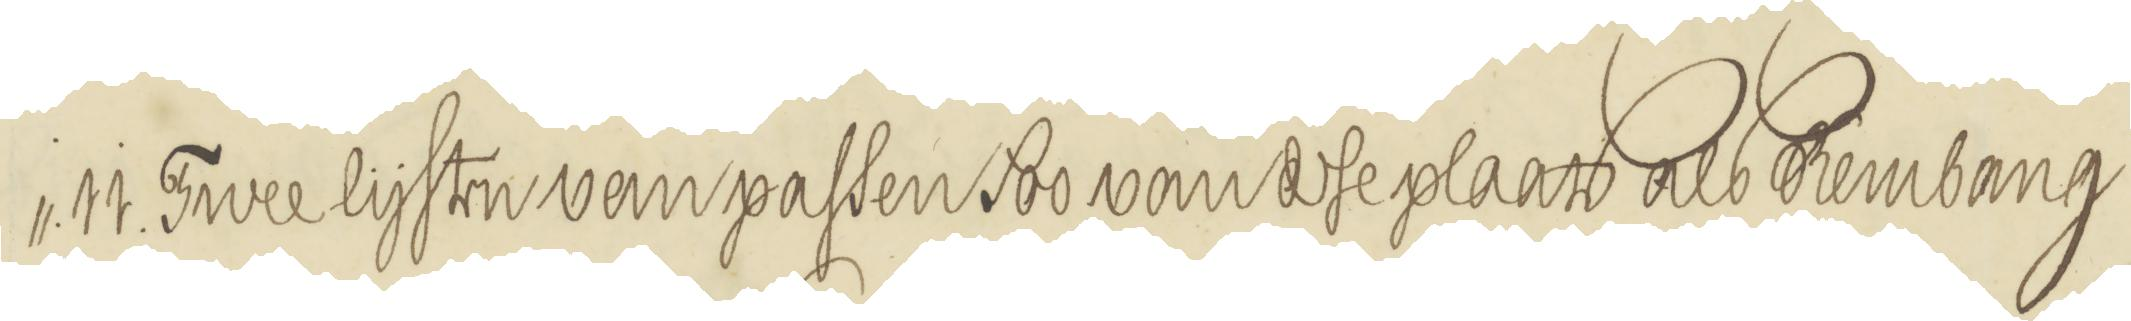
. 11. Twee lijsten van passen soo van dese plaats als Rembang
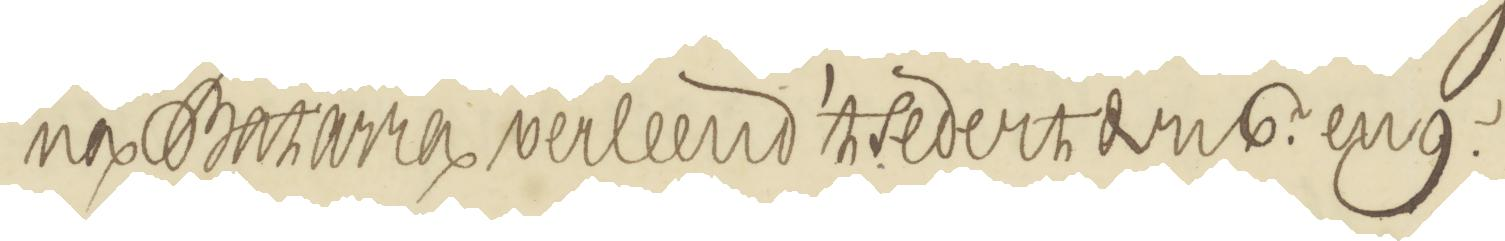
na Batavia verleend 'tsedert den 6.' en 9.'
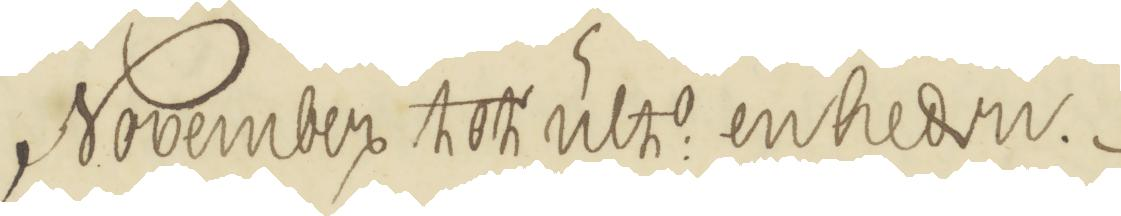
November tot ult:o en heden._
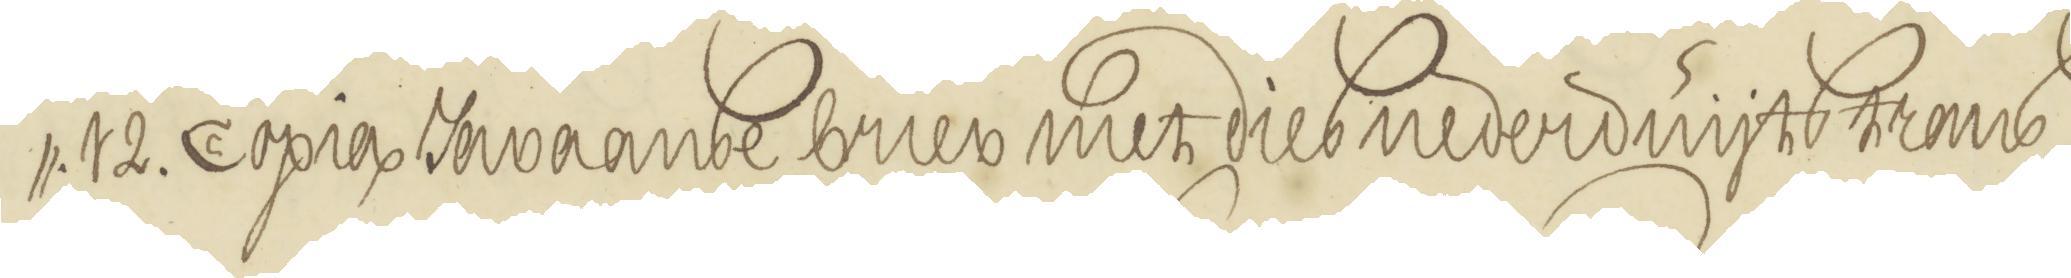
. 12. copia Javaanse briev met dies nederduijts trans
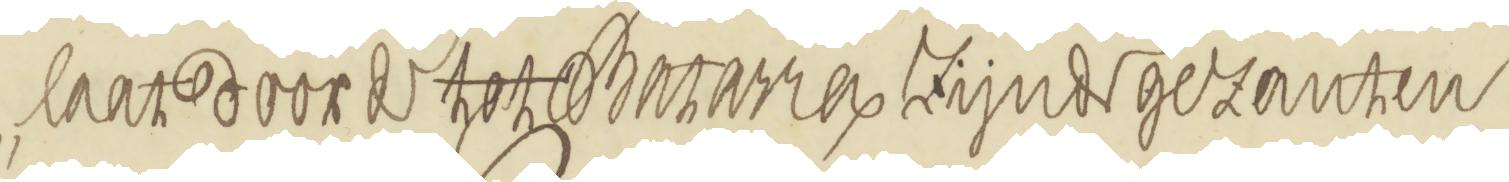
laat door de tot Batavia zijnde gezanten
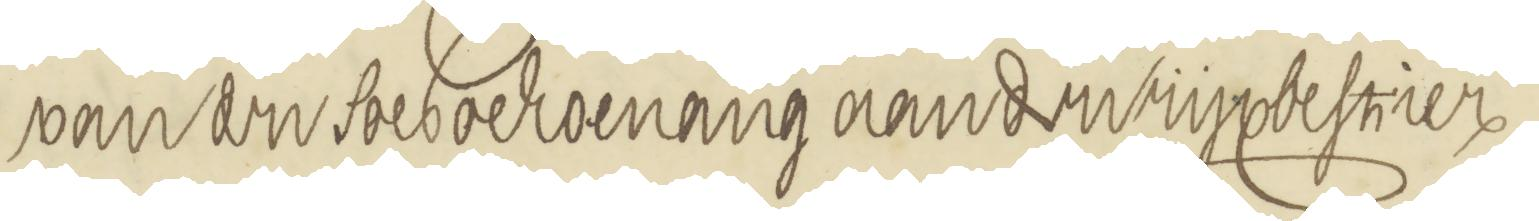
van den soesoehoenang aan den rijxbestier
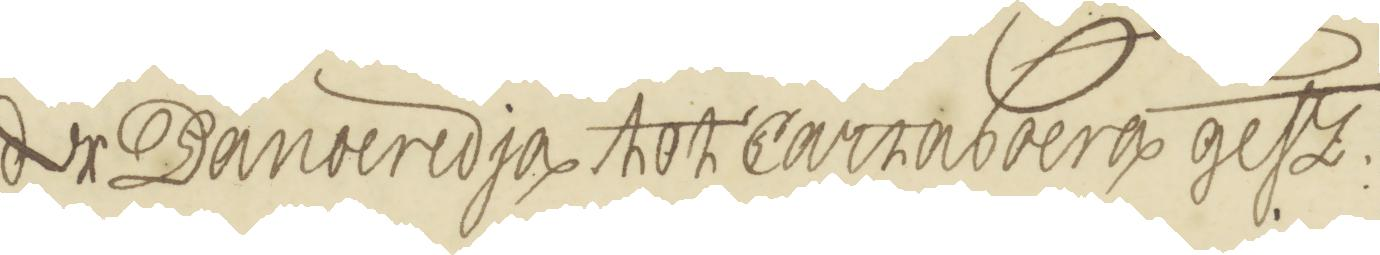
der Danoeredja tot cartasoera gesz
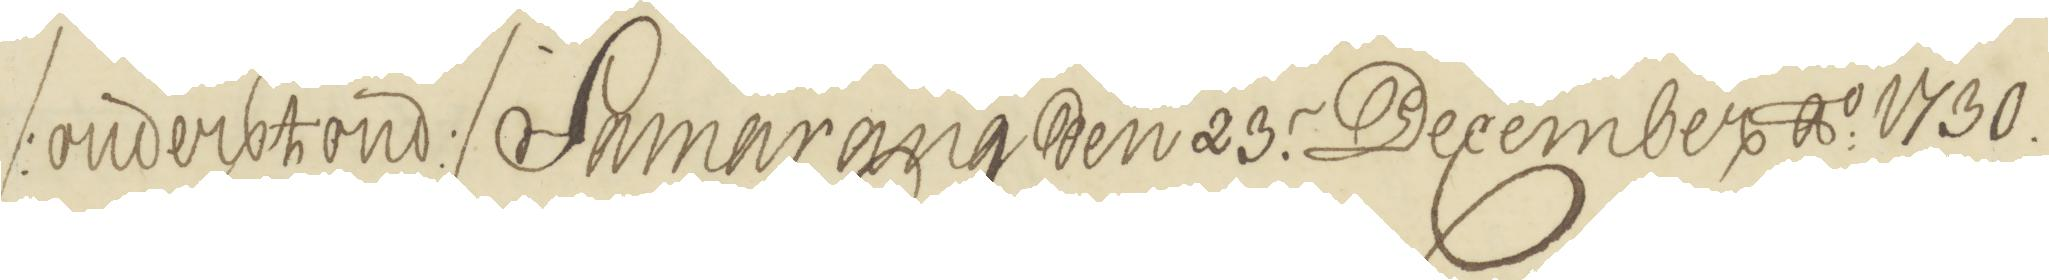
/:onderstond:/ Samarang den 23.' December a:o 1730
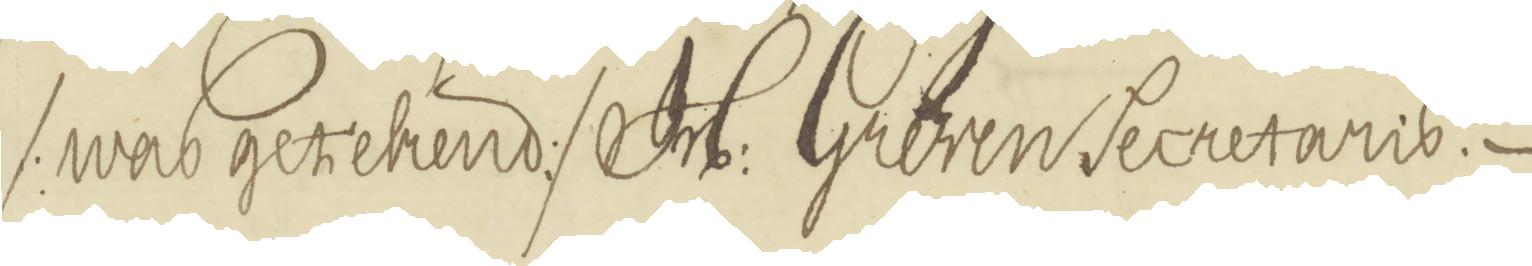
/:was getekend:/ H: Greven secretaris. _
